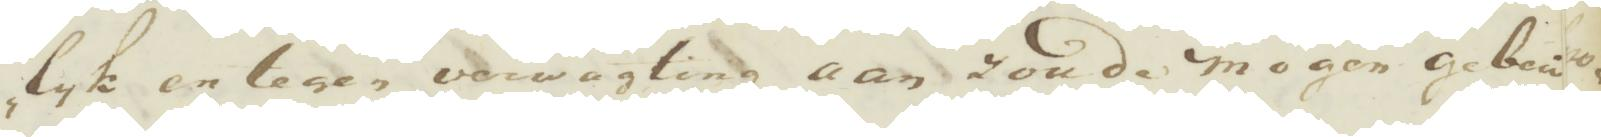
„lijk en tegen verwagting aan zoude mogen gebeu
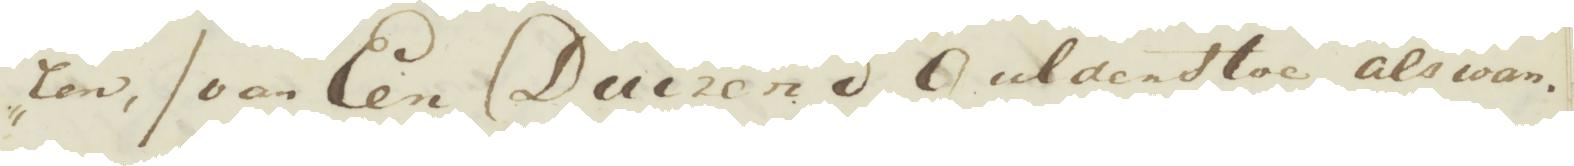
„ren, / van Een Duizend Guldens toe, als wan„
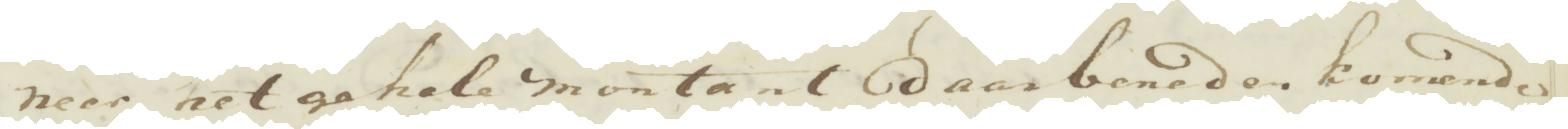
neer het gehele montant daar beneden komende,
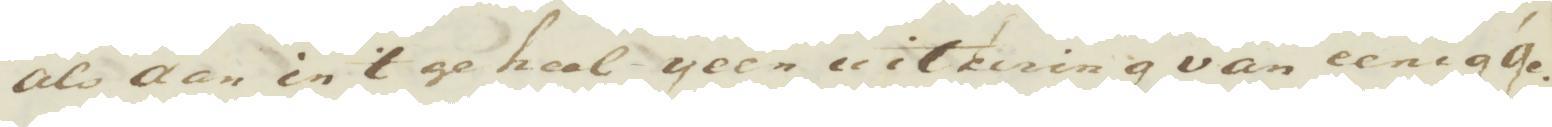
als dan in ’t geheel geen uitkering van eenig ge„
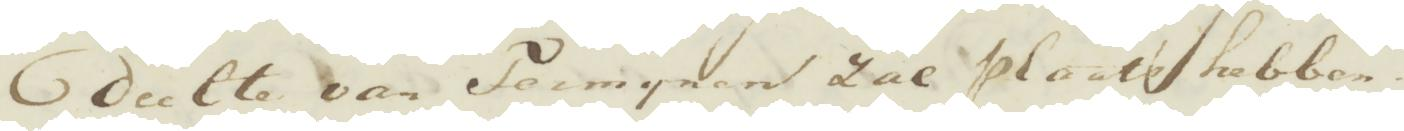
deelte van Termynen zal plaats hebben.
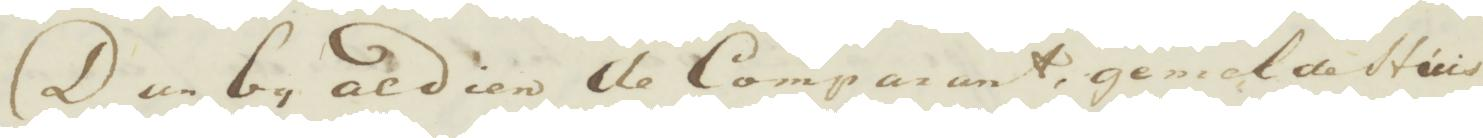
Dan by aldien de Comparant, gemelde Huis
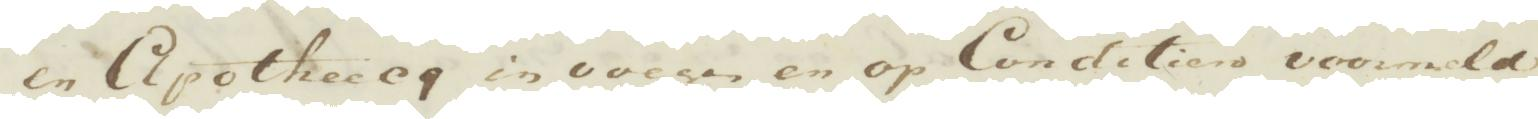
en Alpotheecq in voegen en op Conditien voormeld,
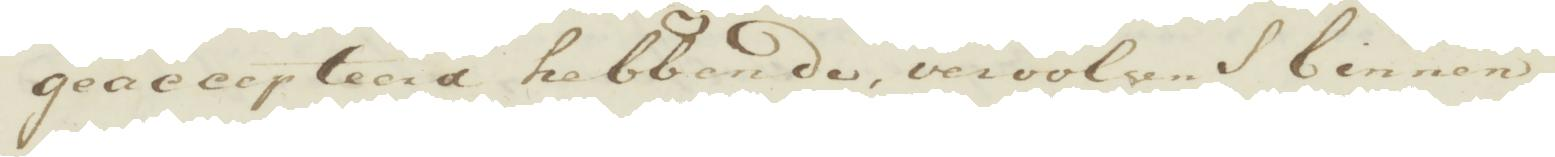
geaccepteerd hebbende, vervolgens binnen
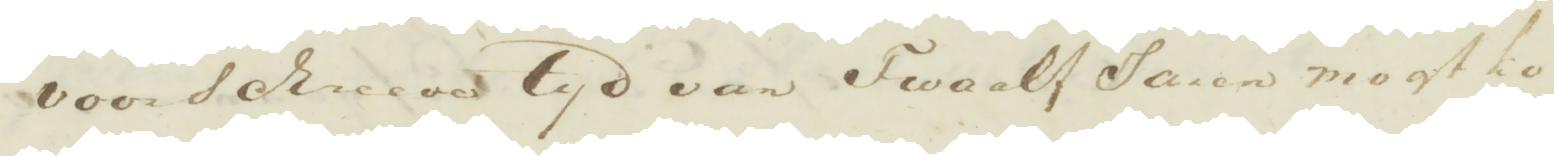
voorschreeve tyd van Twaalf Jaren mogt ko
